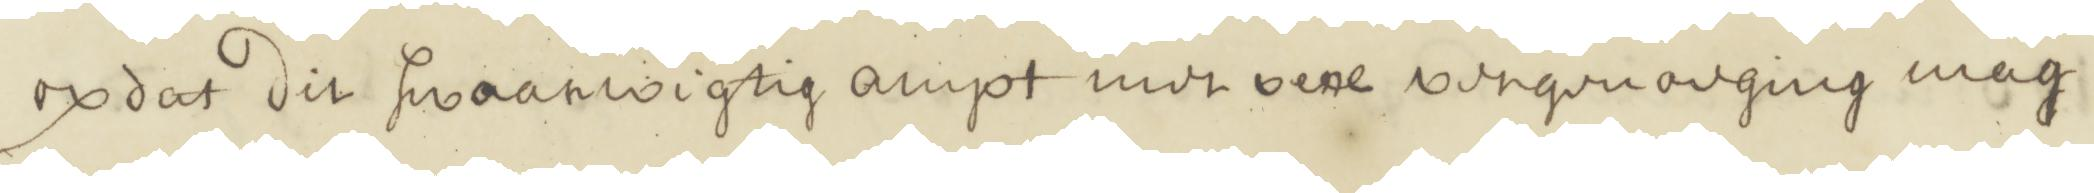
op dat dit swaarwigtig ampt met veel vergenoeging mag
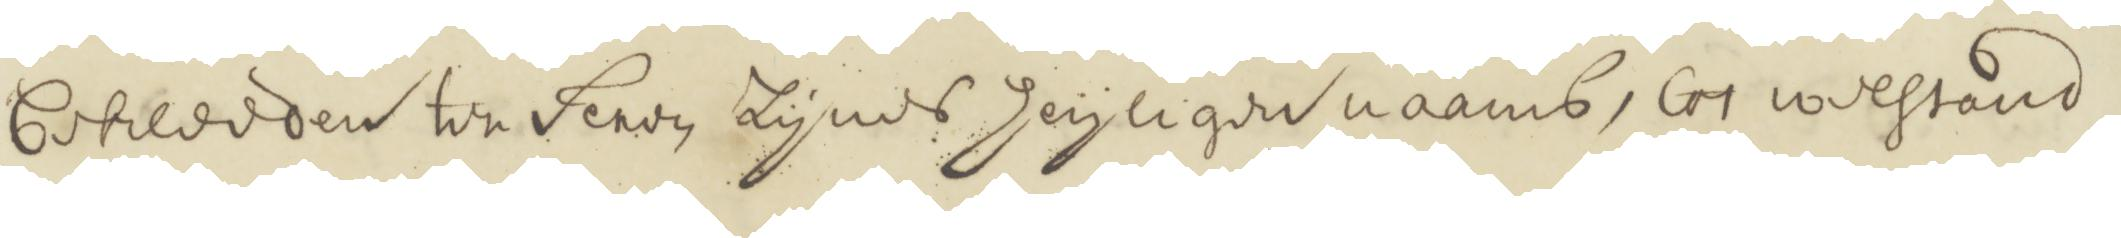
bekleeden ter Eeren zijnes heijligen naams, tot welstand
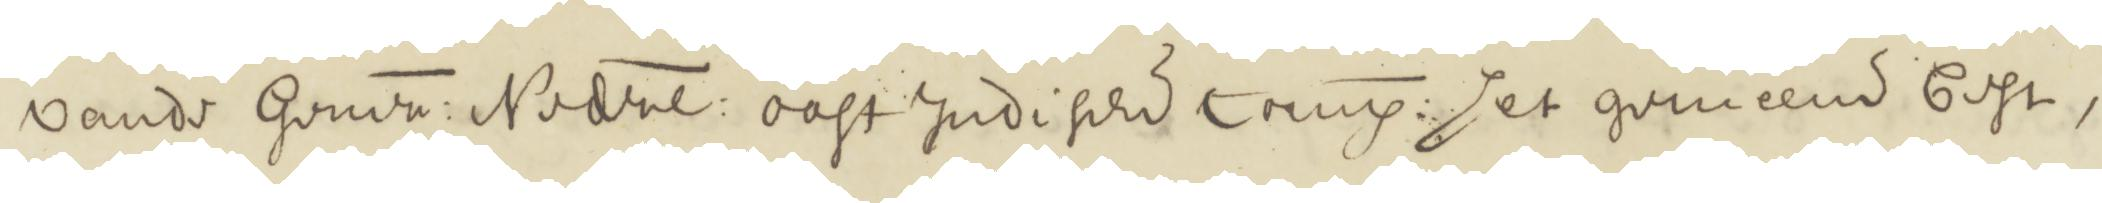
vande Gener: Nederl: oost Jndische Comp: het gemeene best,
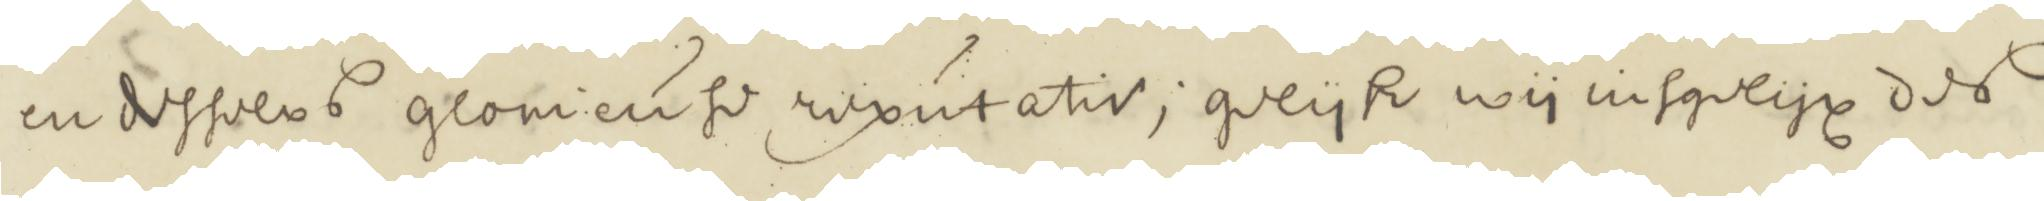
en desselvs glorieuse reputatie; gelijk wij insgelijx des
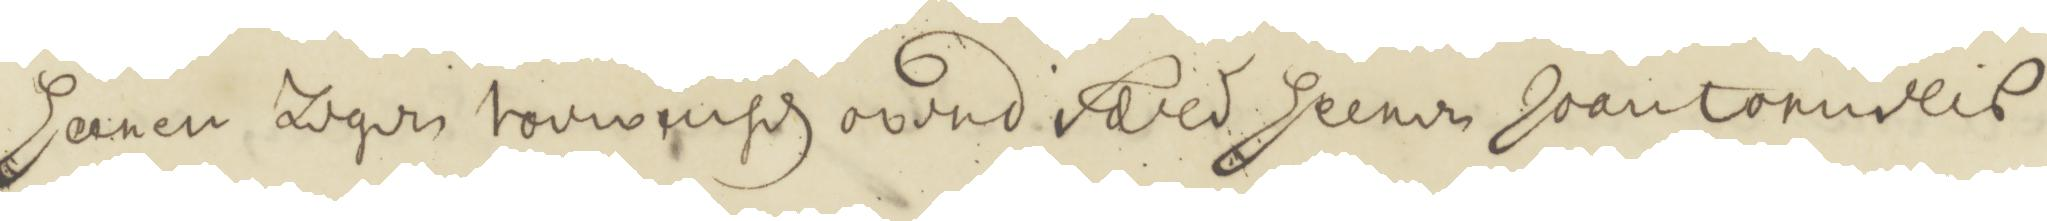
heeren zegen toewensen over d’Edele Heeren Joan Cornelis
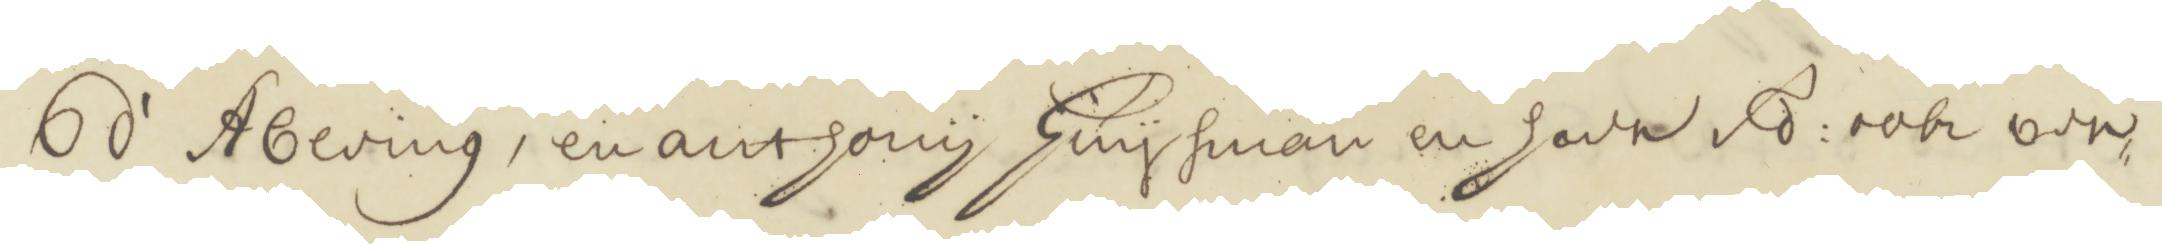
d’Ableing, en anthonij Huijsman en haer Ed: ook ver„
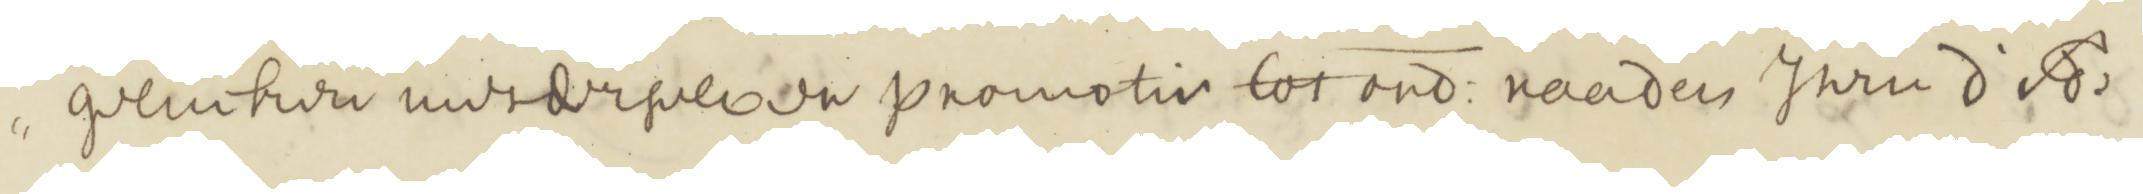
„gelucken met derselver promotie tot ord: raaden Jtem d’Ed:
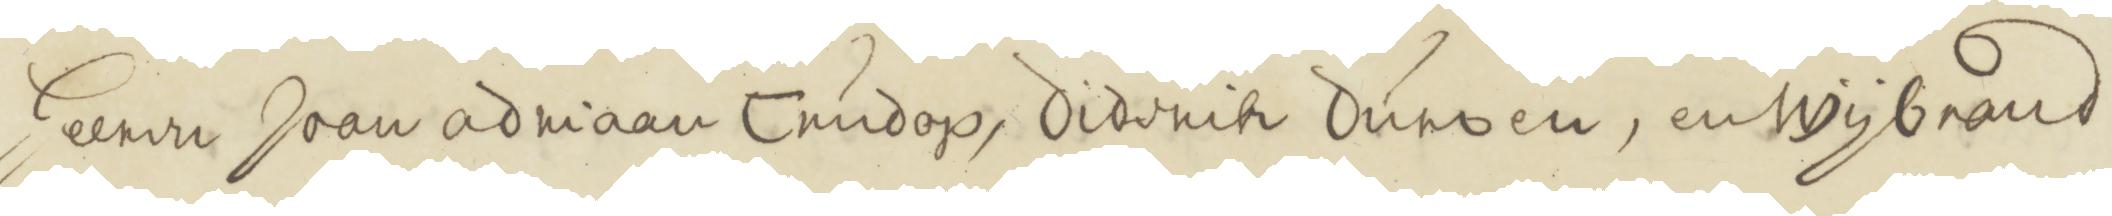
Heeren Joan adriaan Crudop, Diderik Durven, en Wijbrand
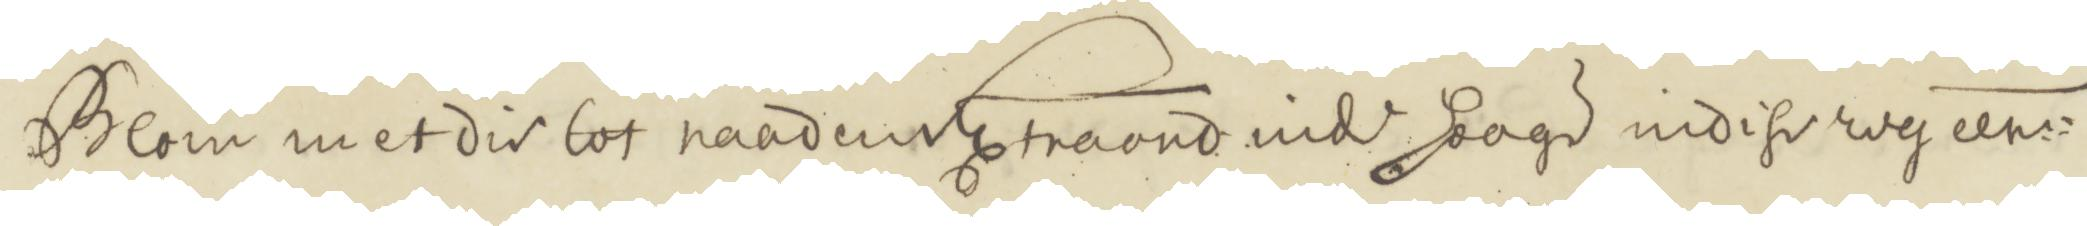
Blom met die tot raad en Extraord: inde hoge indise regeeri:
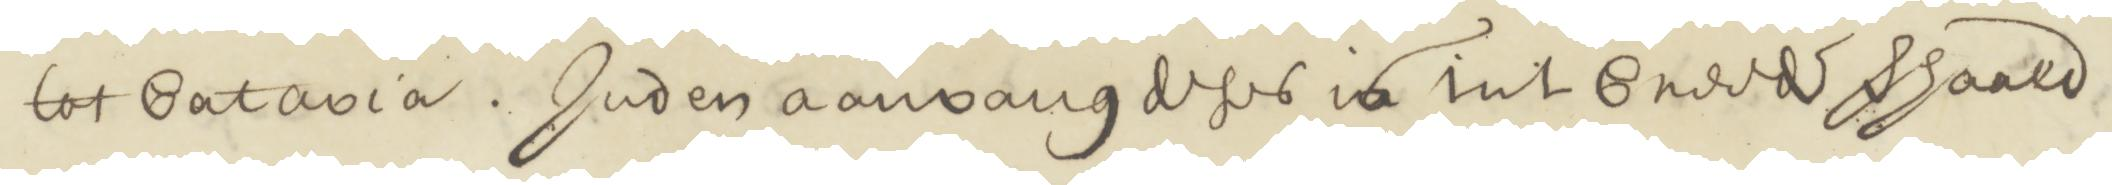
tot batavia. Jnden aanvang deses is in't breede verhaald
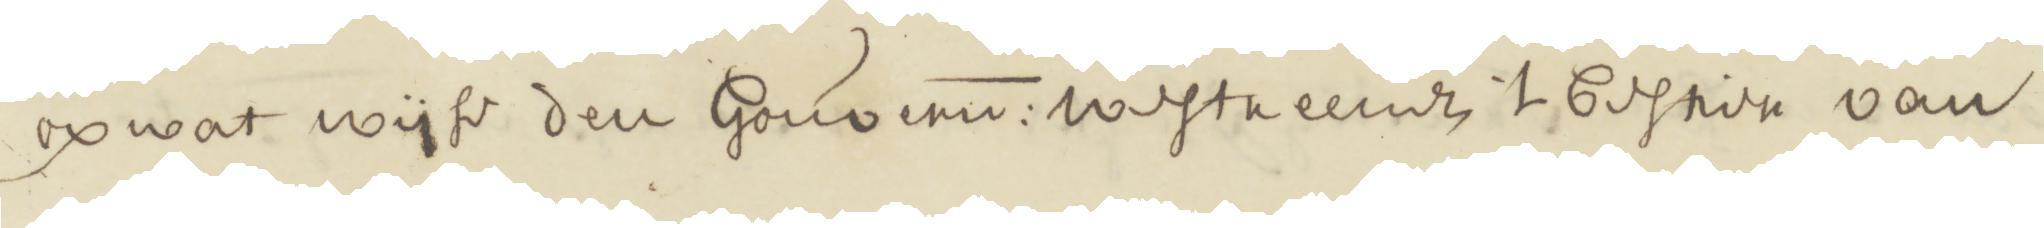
op wat wijse den Gouvern: westreenen ’t bestier van
